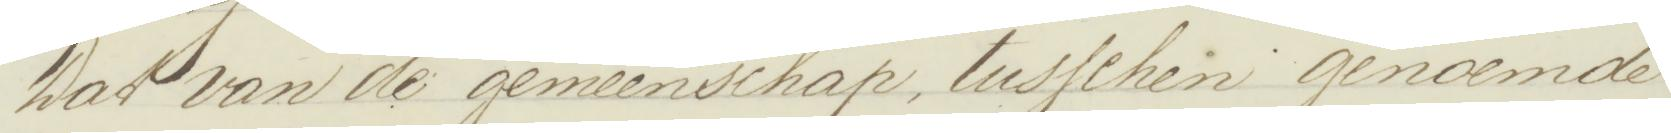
Dat van de gemeenschap, tusschen genoemde
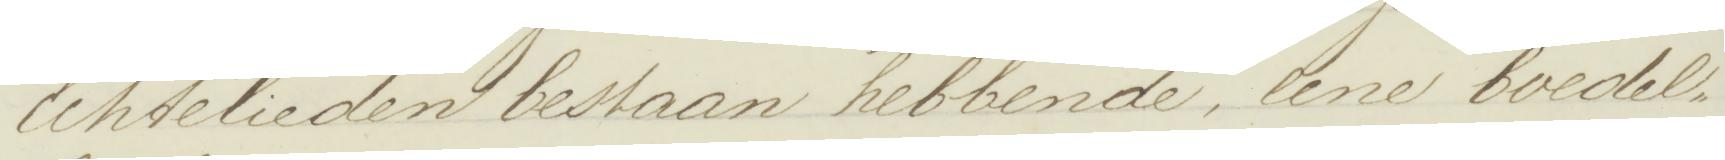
Echtelieden bestaan hebbende, Eene boedel„
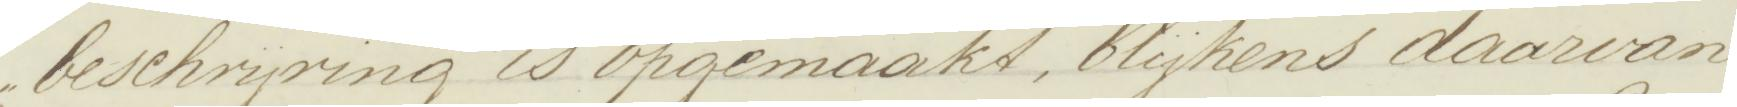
„beschrijving is opgemaakt, blijkens daarvan
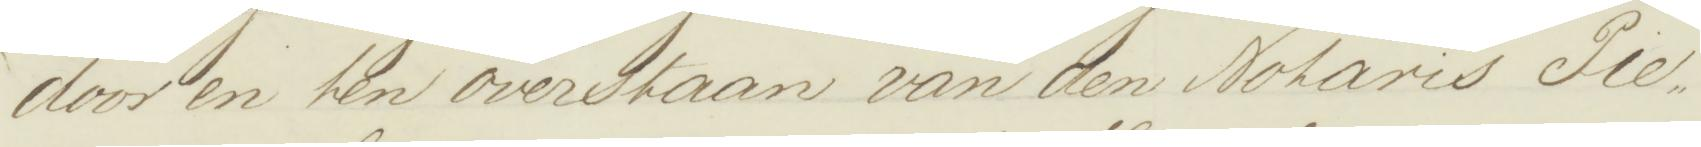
door en ten overstaan van den Notaris Pie„
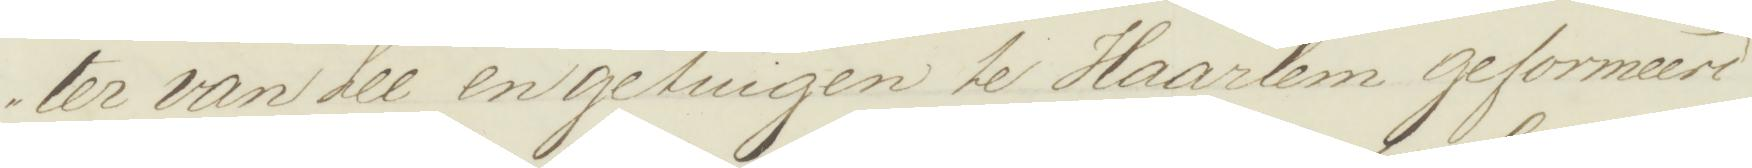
„ter van Lee en getuigen te Haarlem geformeerd
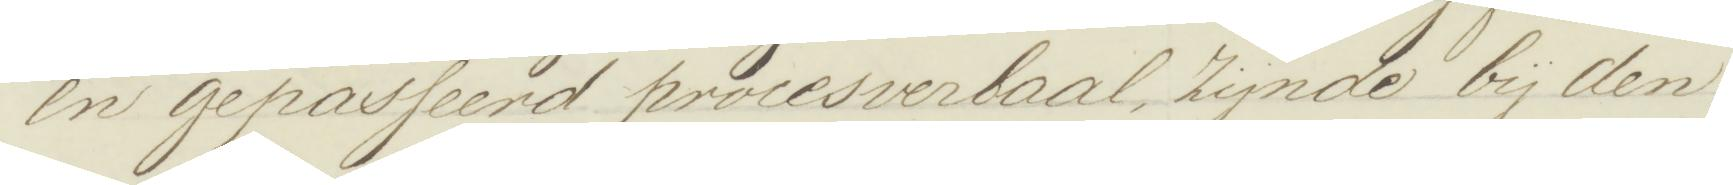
en gepasseerd procesverbaal, zijnde bij den
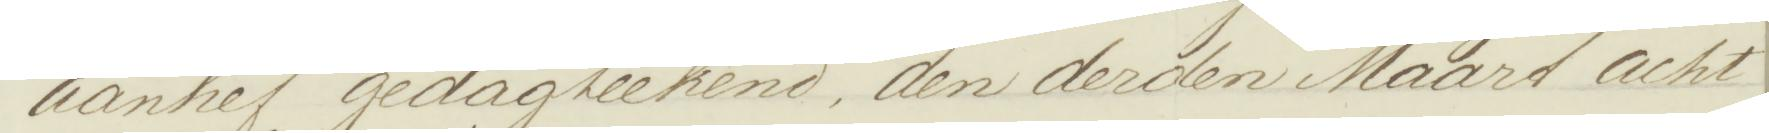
aan het gedagteekend, den derden Maart acht
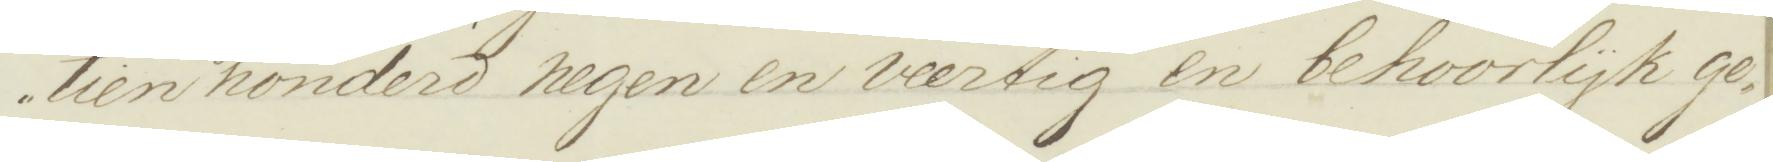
„tien honderd negen en veertig en behoorlijk ge„
